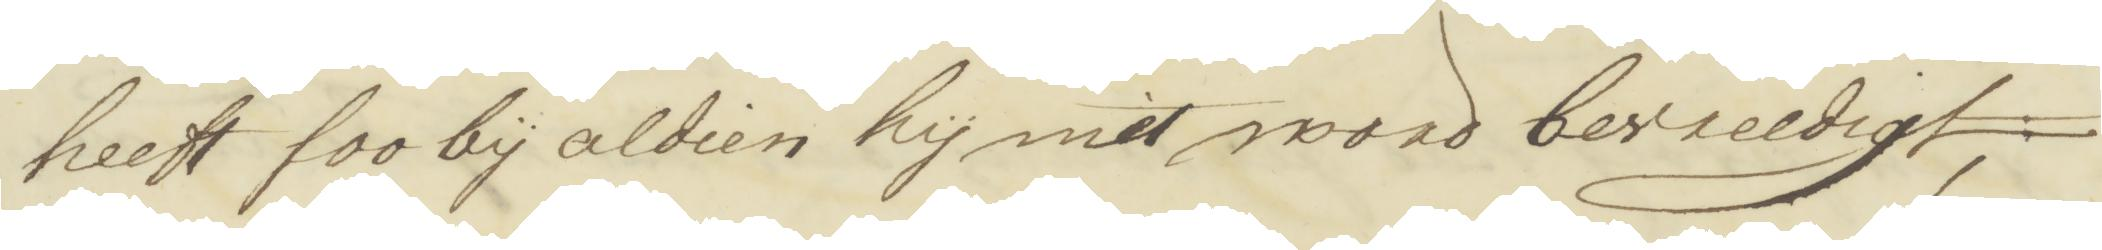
heeft soo bij aldien hij niet word bevreedigt,
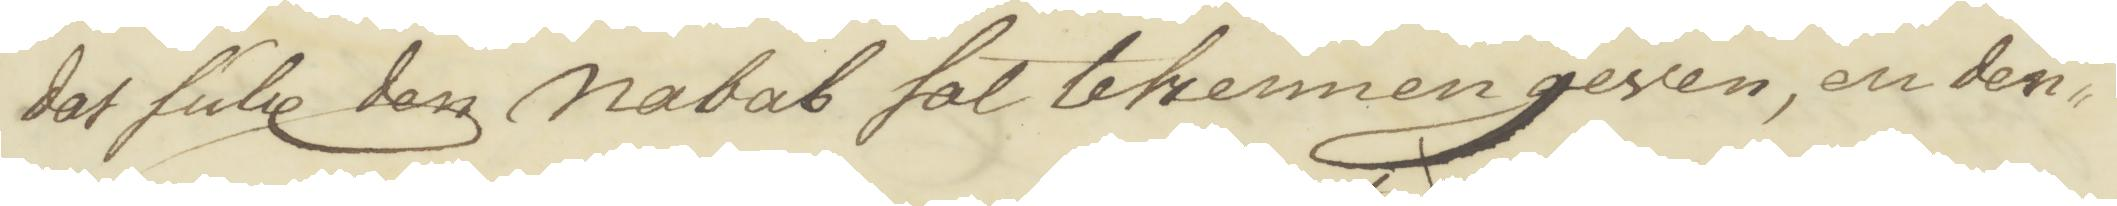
dat sulx den nabab sal tekennen geven, en den„
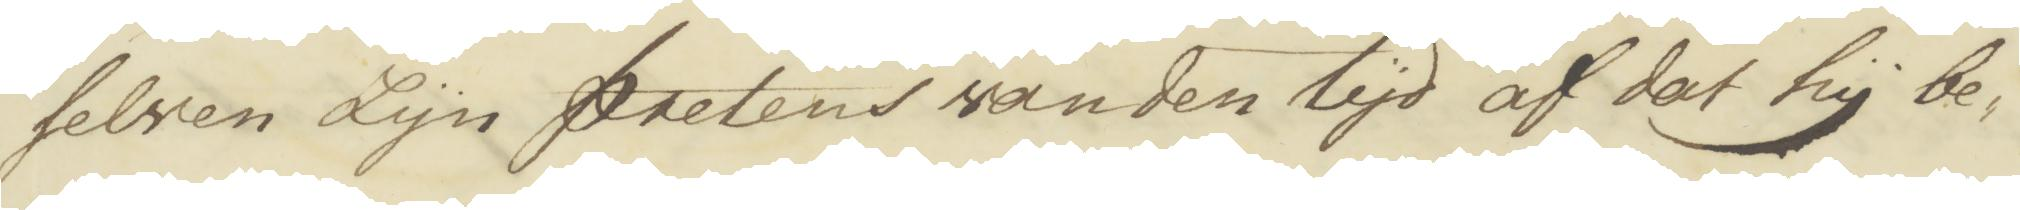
selven zijn pretens van den tijd af dat hij be„
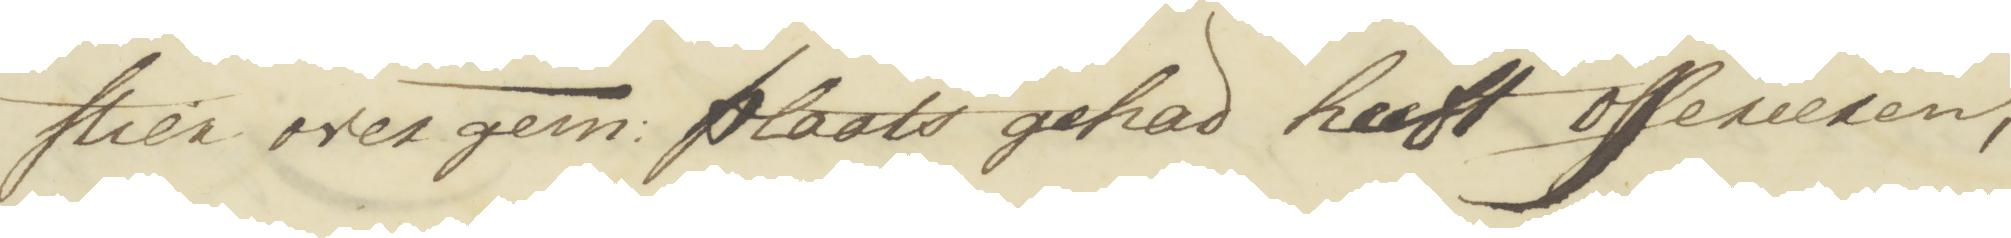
stier over gem: plaats gehad heeft offereeren,
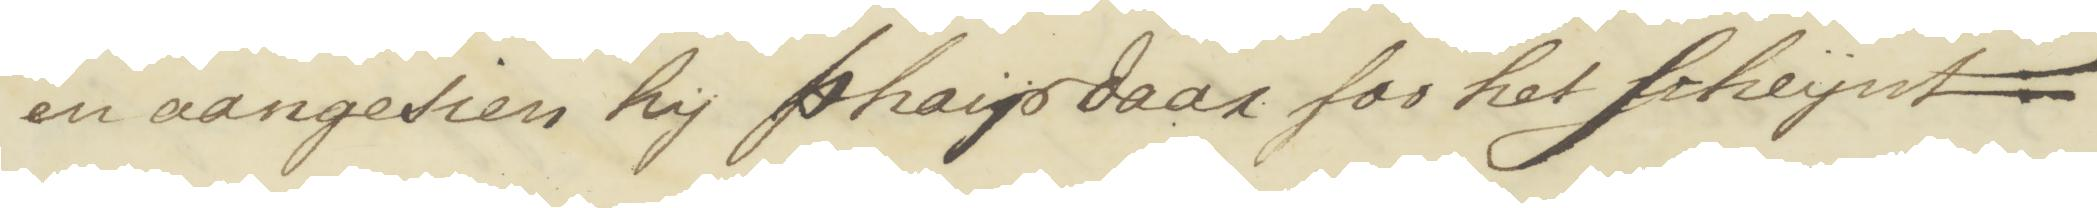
en aangesien hij phaijsdaar soo het scheijnt
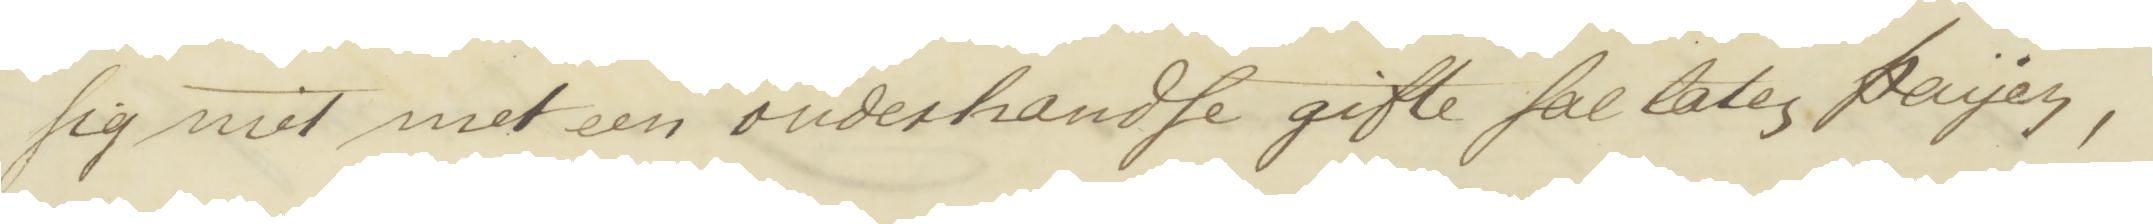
sig niet met een onderhandse gifte sal laten paijen,
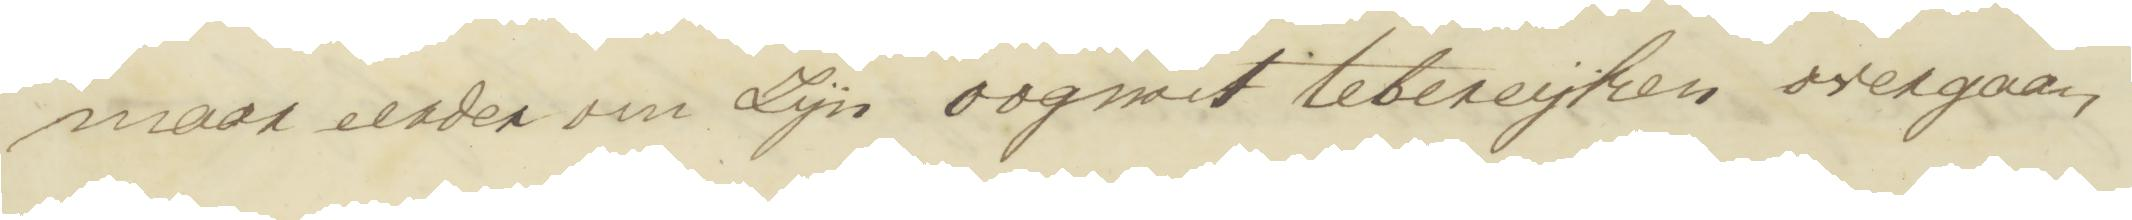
maar eerder om zijn oogwit tebereijken overgaan
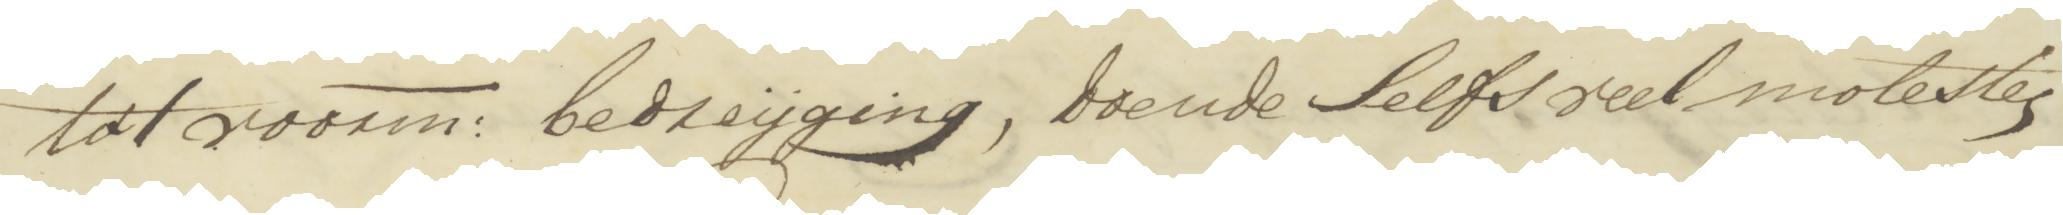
tot voorm: bedreijging, doende selfs veel molesten
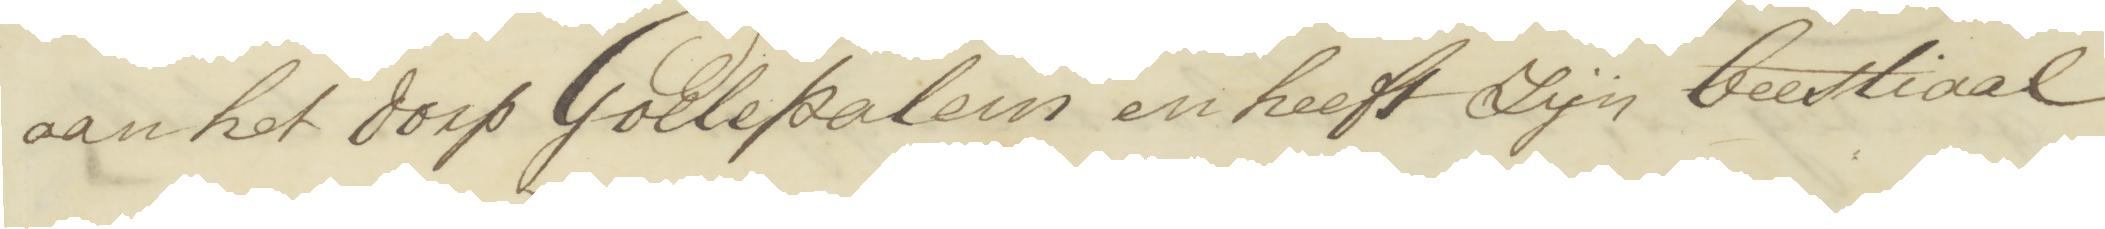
aan het dorp Goelepalem en heeft zijn beestiaal
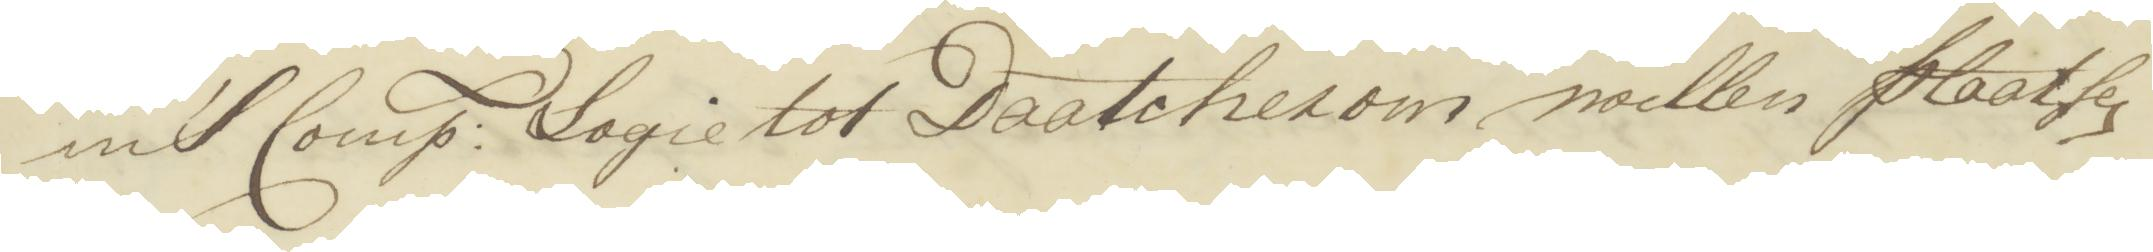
in’s Comp: Logie tot Daatcherom willen plaatsen
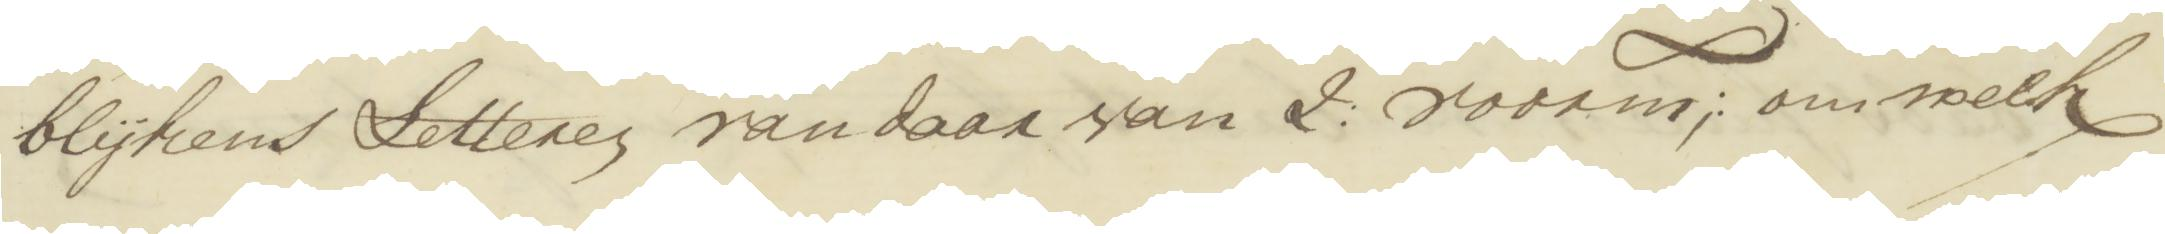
blijkens Letteren van daar van 2:' voorm:, om welk
